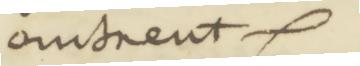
omtrent —
